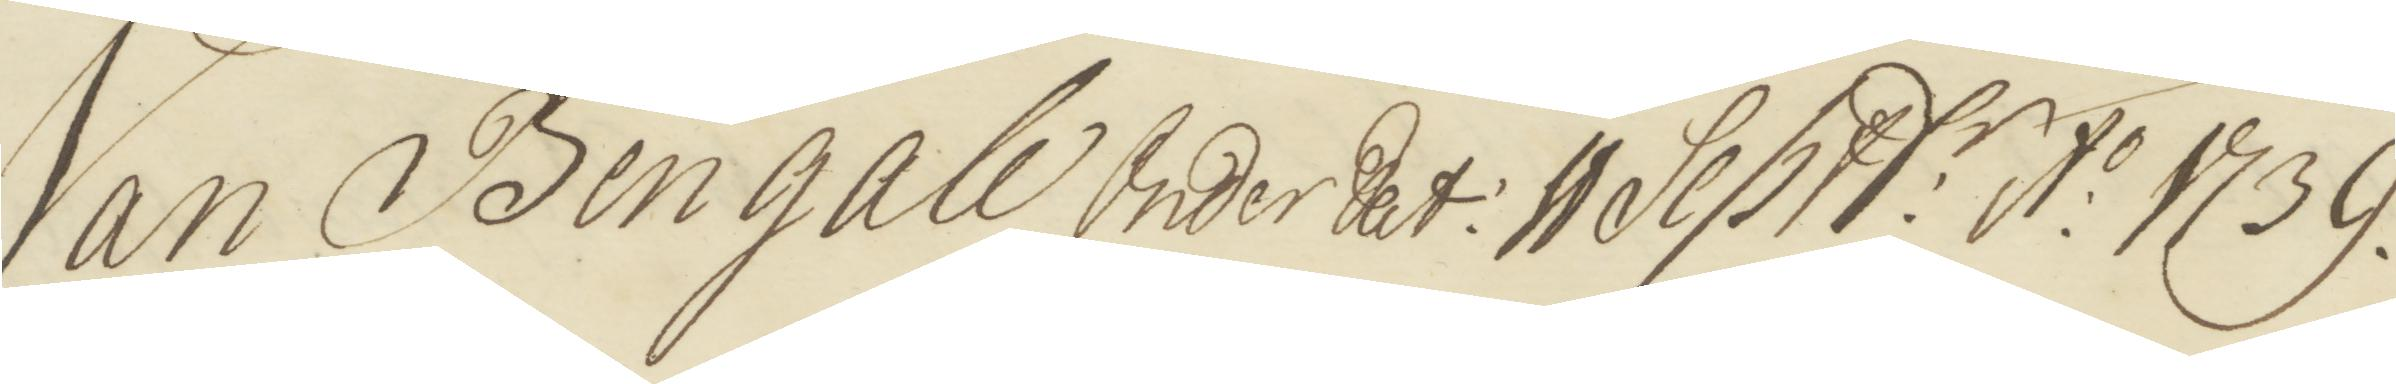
Van Bengale onder dat: 11 septb:r A:o 1739.
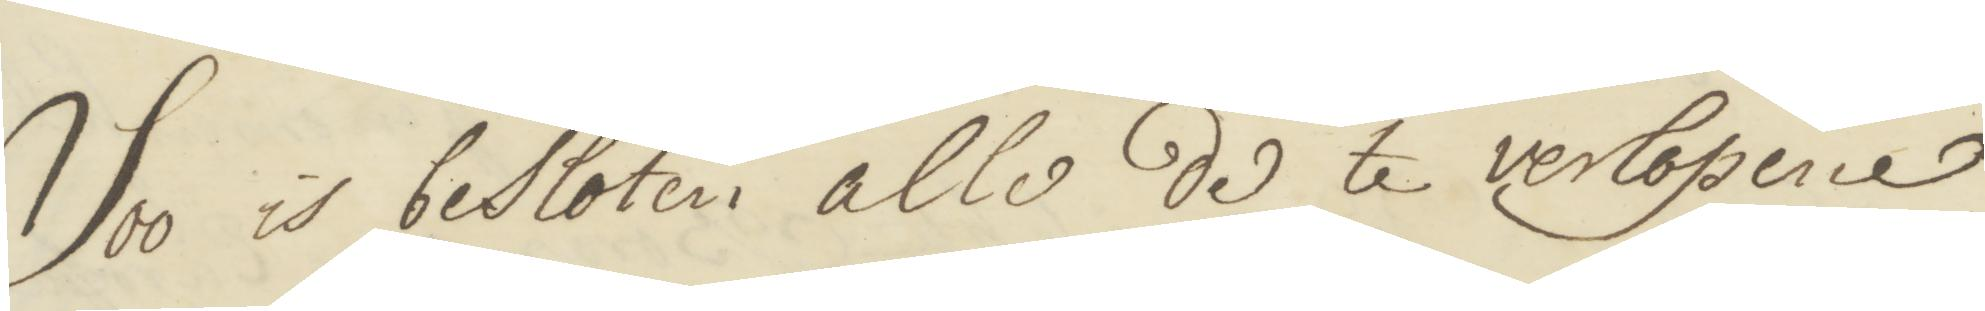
Soo is besloten alle de te verlopene
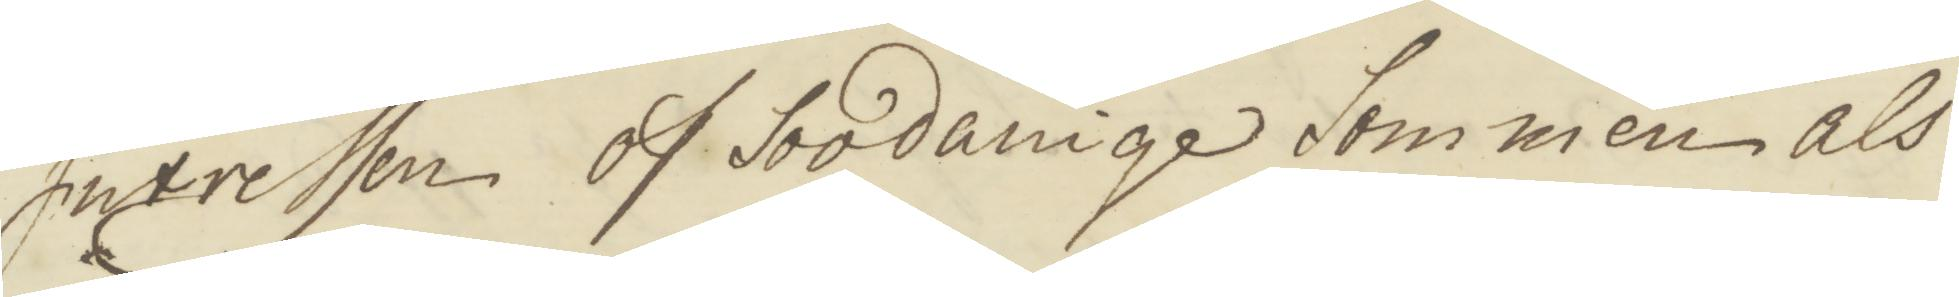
jntressen of soodanige sommen als
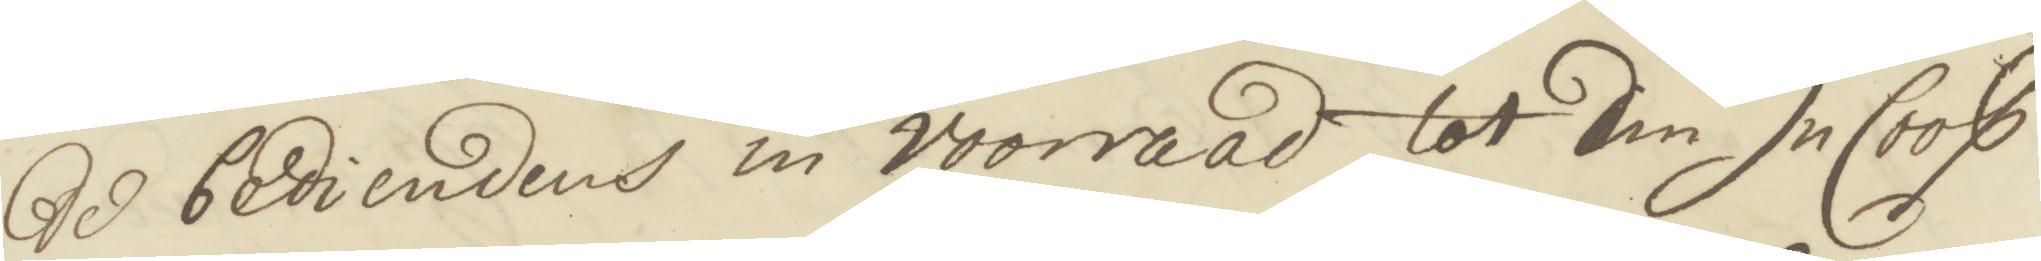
de bediendens in voorraad tot den jn Coop
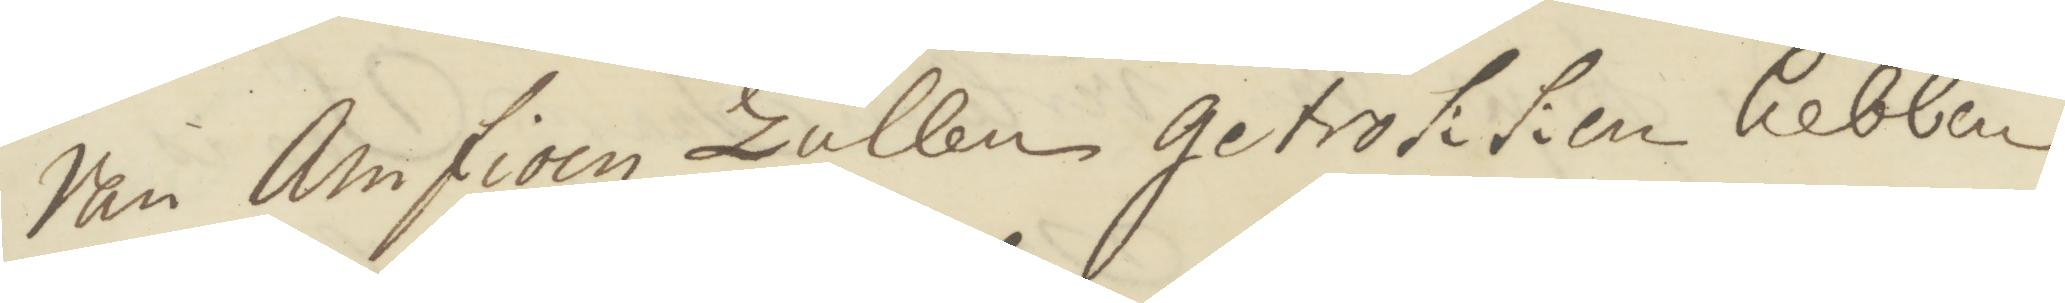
van Amfioen zullen getrokken hebben
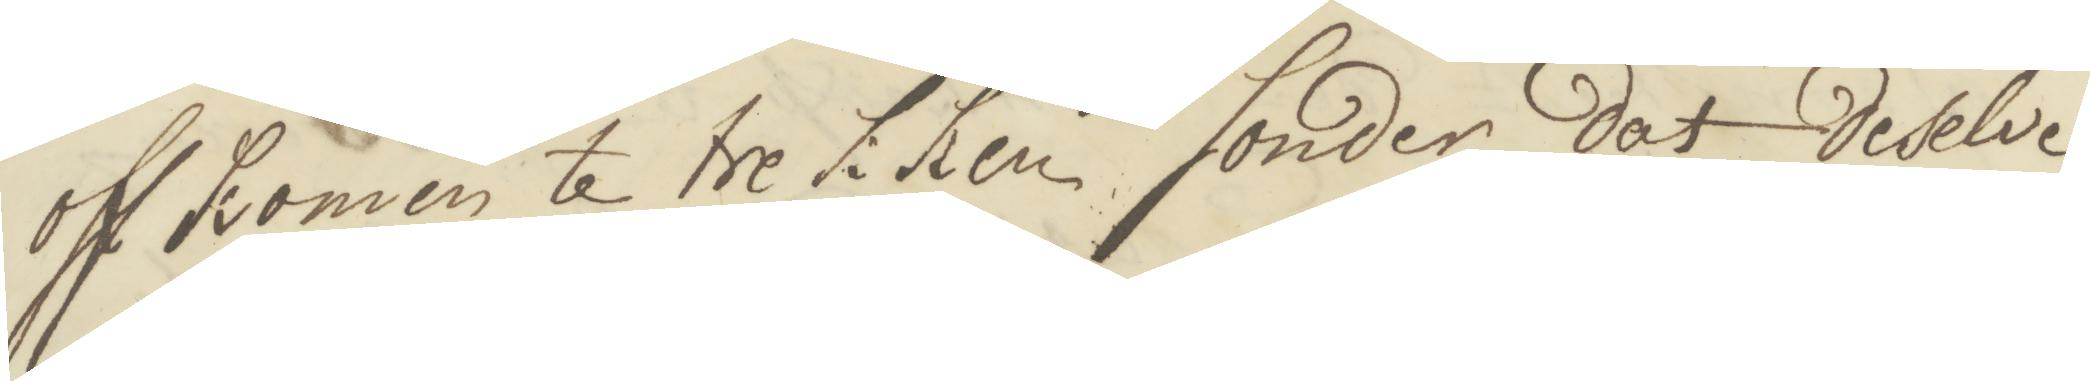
off komen te trekken sonder dat deselve
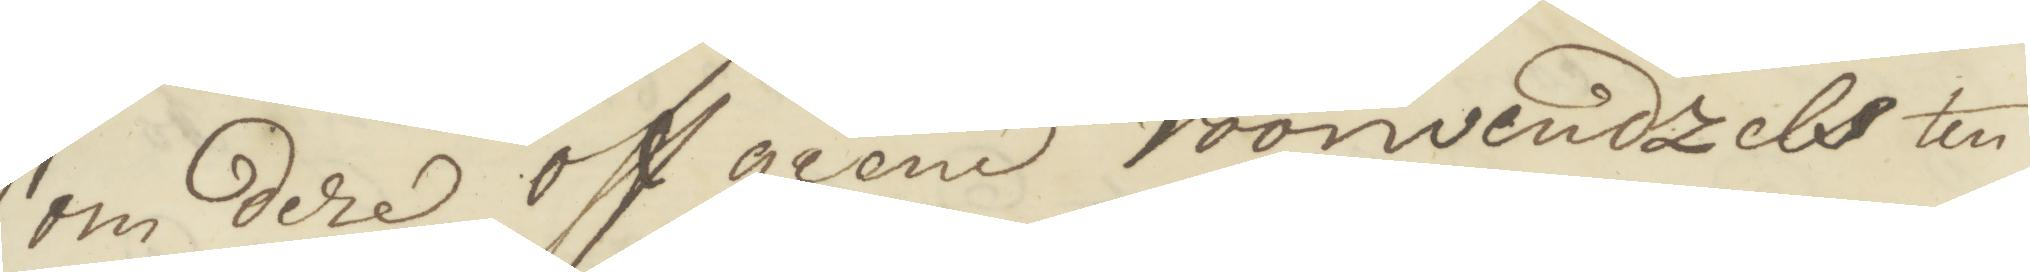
om deze off geene voorwendzels ten
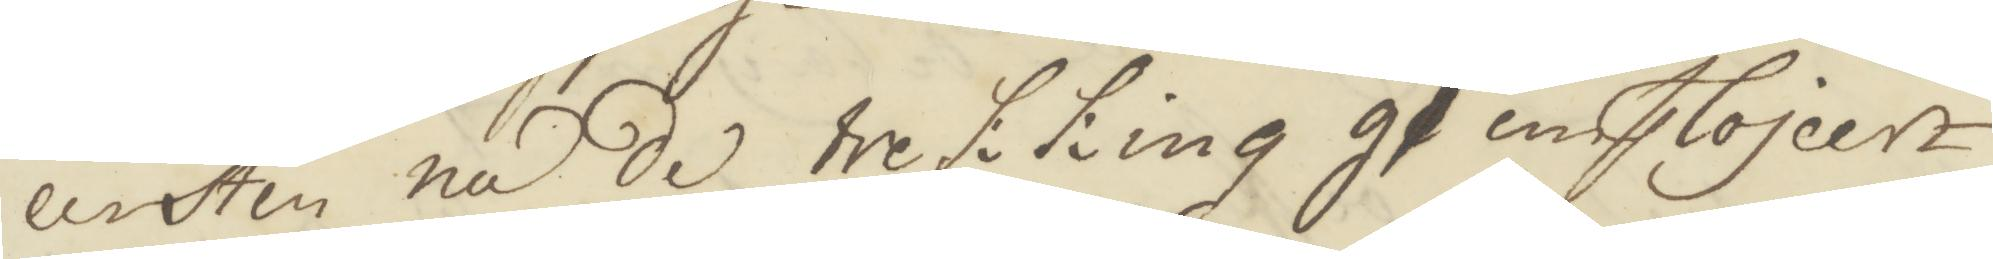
eersten na de trekking g' emplojeert
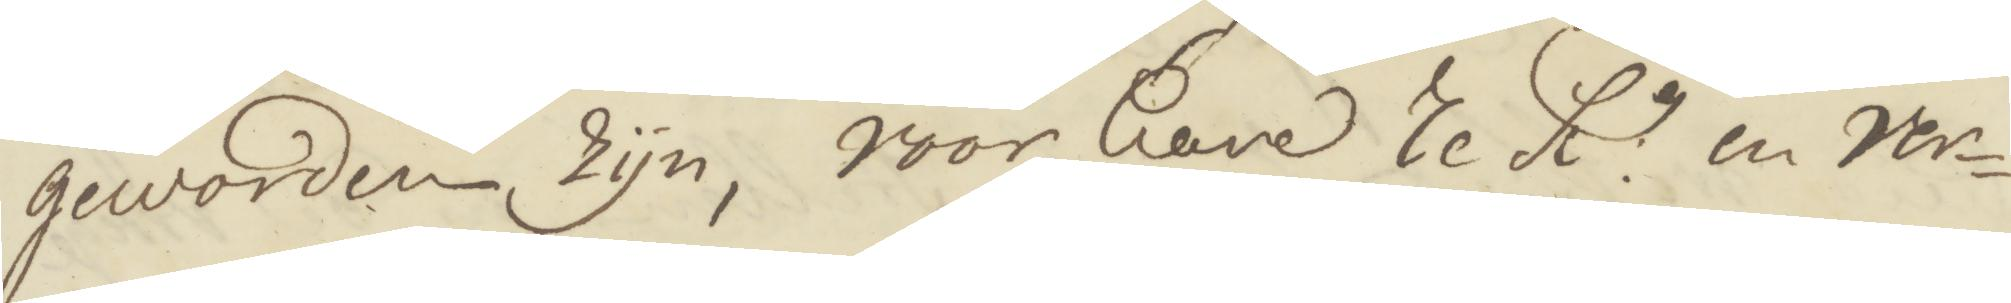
geworden zijn, voor hare rek:g en ver=
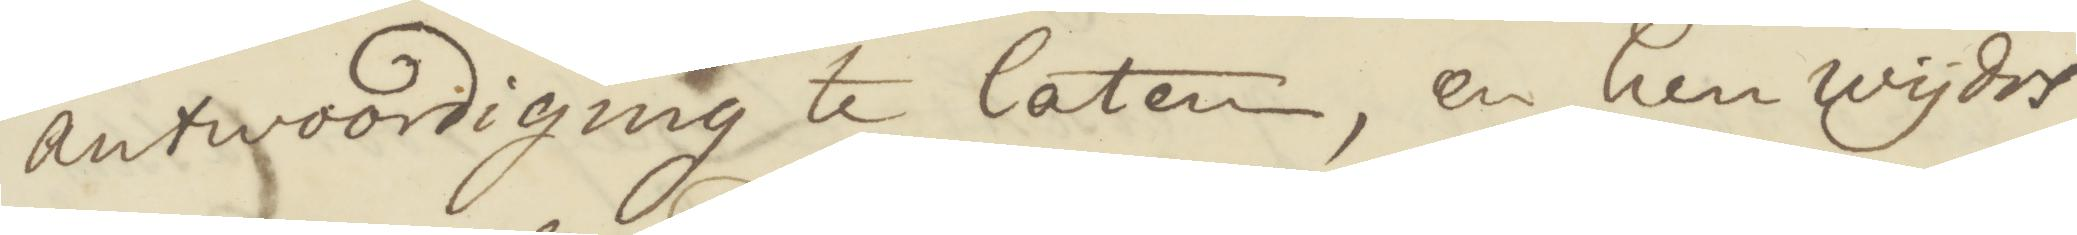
antwoordiging te laten, en hen wijders
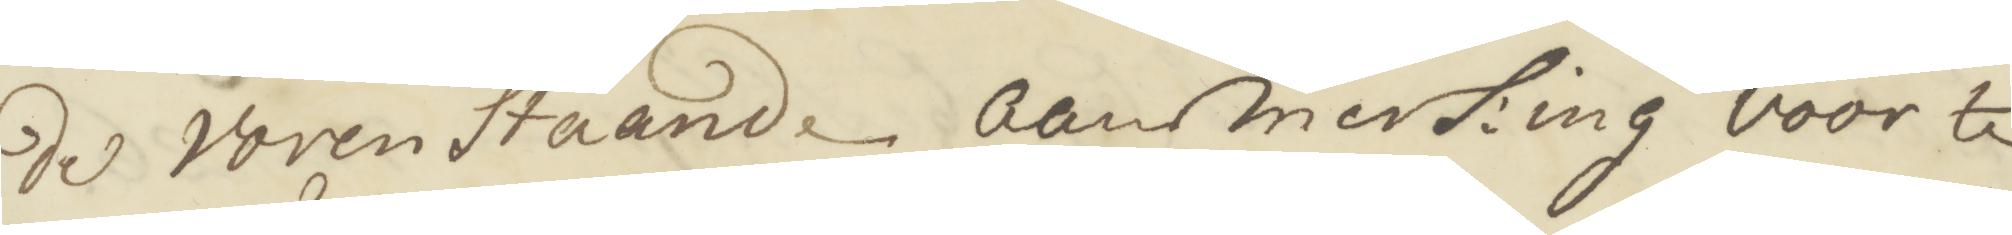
de vorenstaande aanmerking voor te
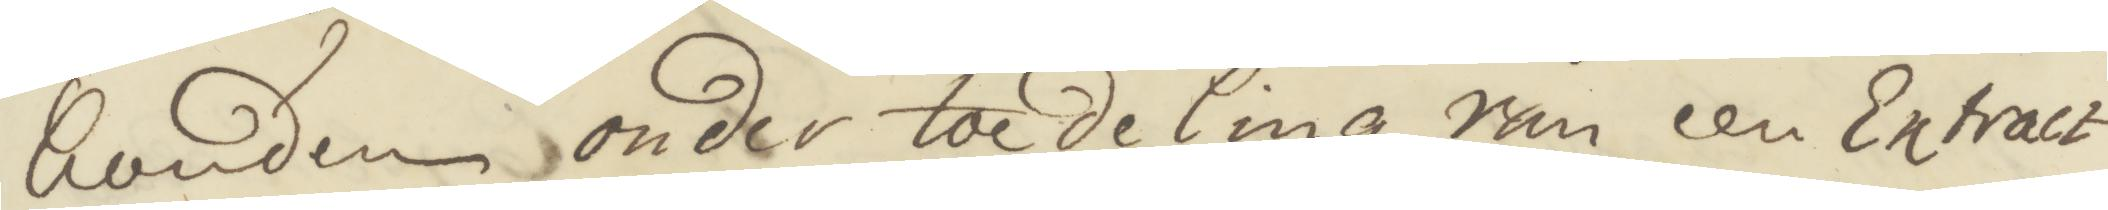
houden onder toedeling van een Exract
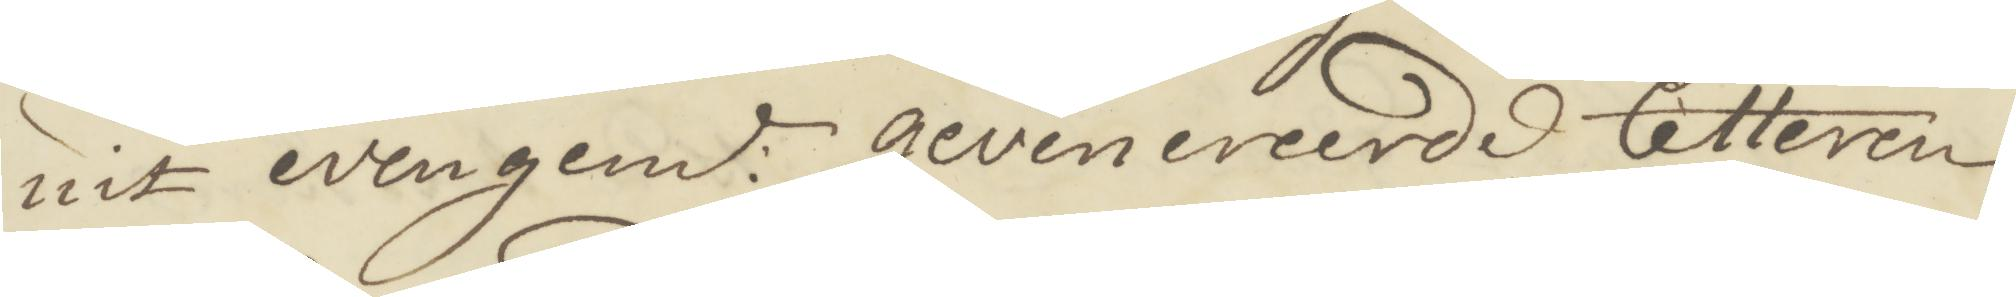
uit evengem:e gevenereerde letteren
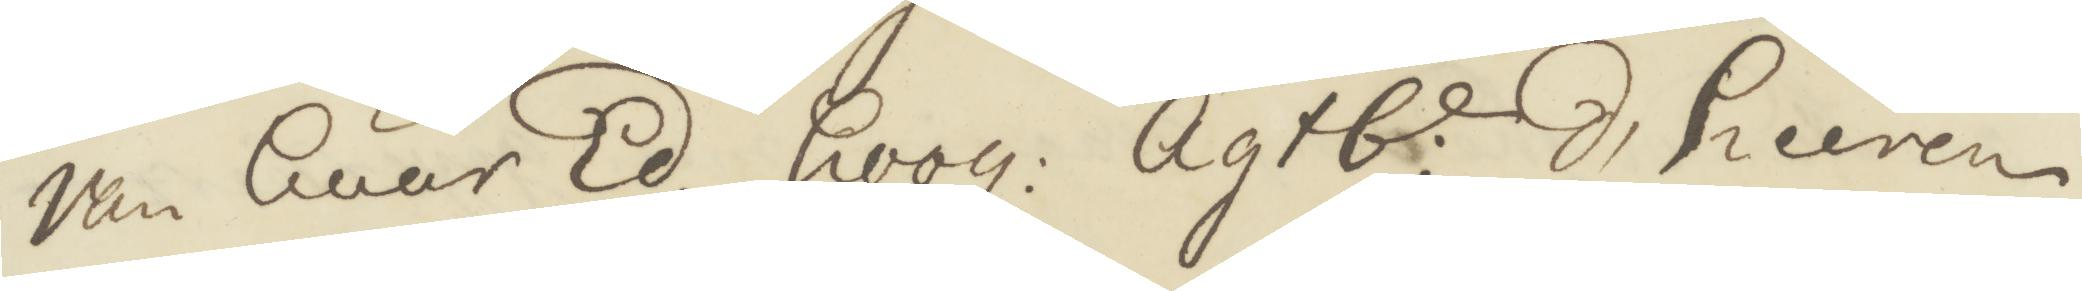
van haar Ed. hoog: Agtb:e d' heeren
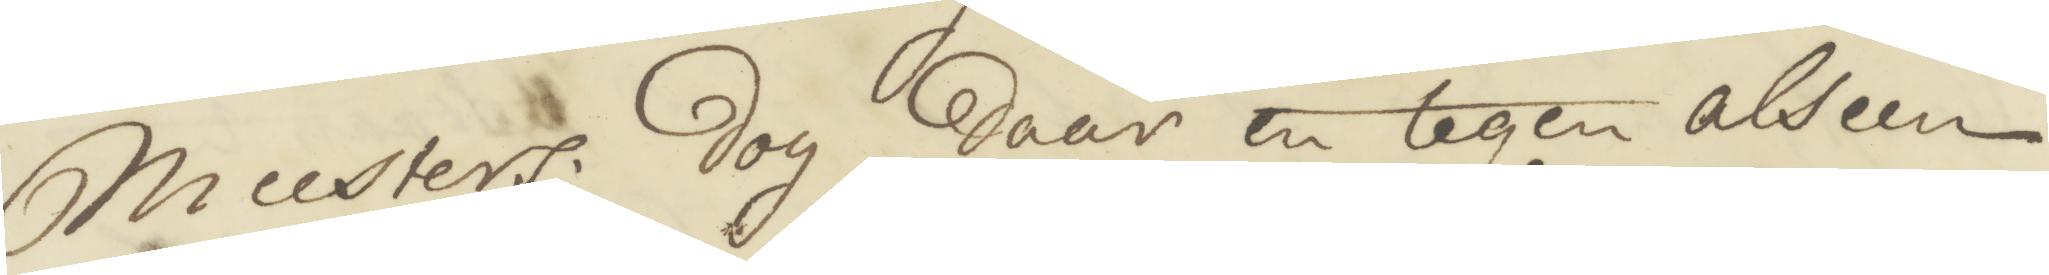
meesters: dog daar en tegen als een
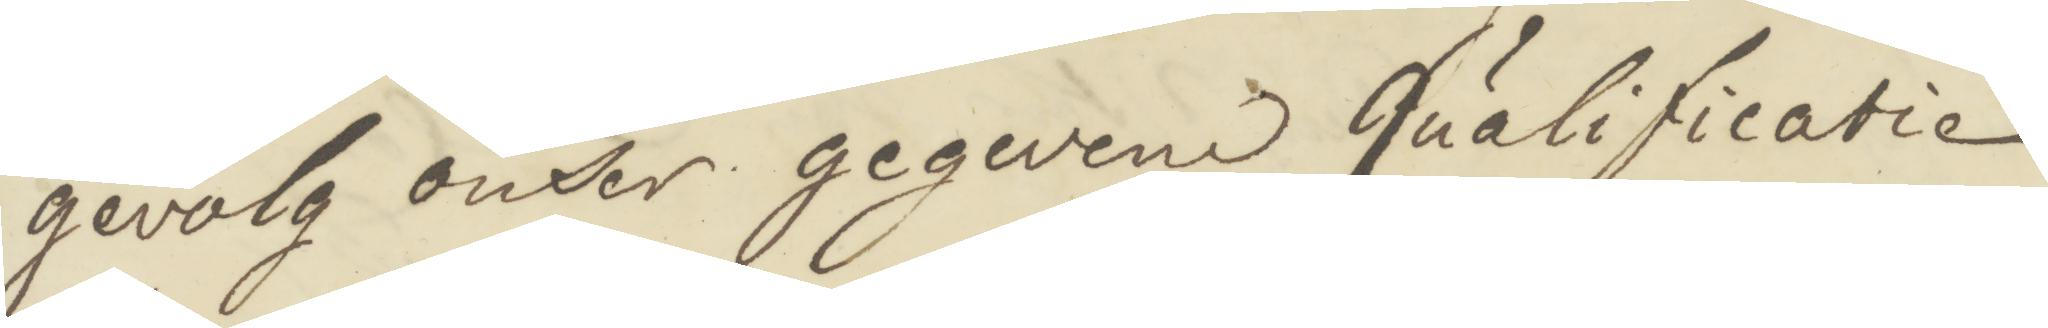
gevolg onser gegevene qualificatie
